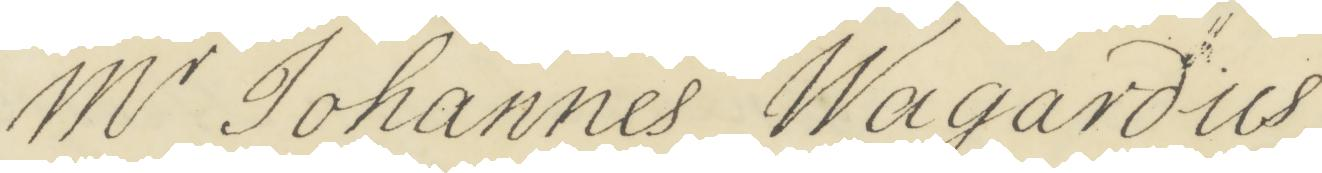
Mr Johannes Wagardus
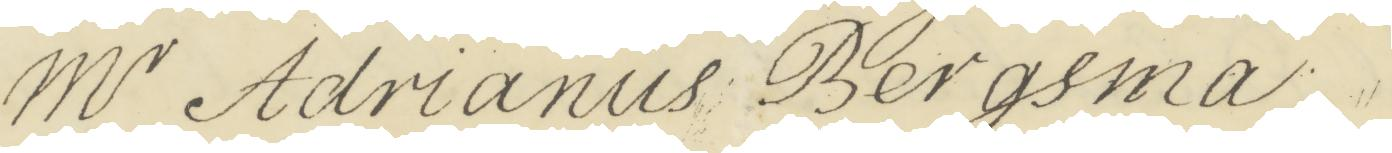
Mr Adrianus Bergsma
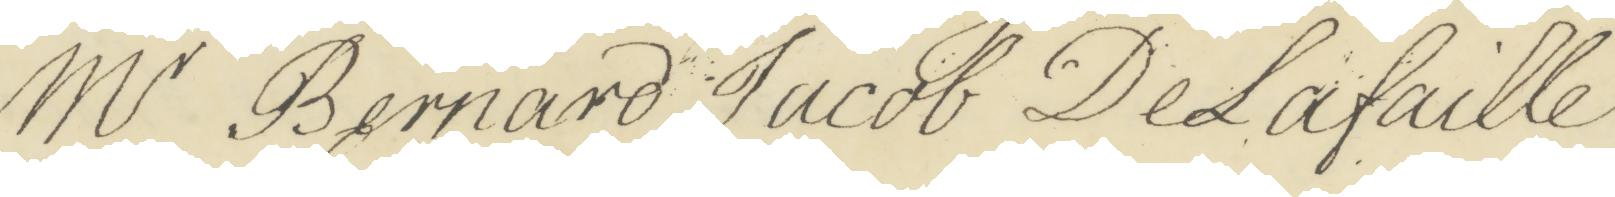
Mr Bernard Iacob De Lafaille
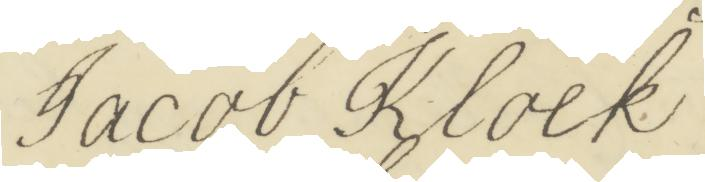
Jacob Kloek
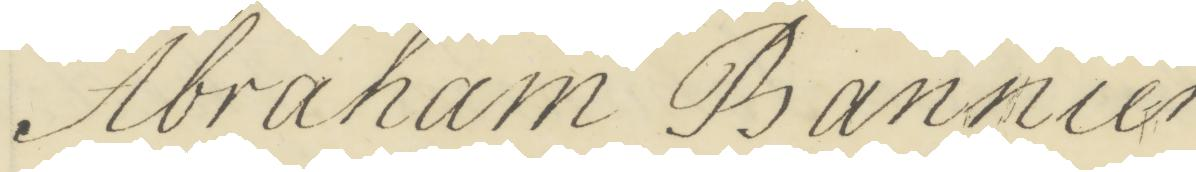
Abraham Bannier
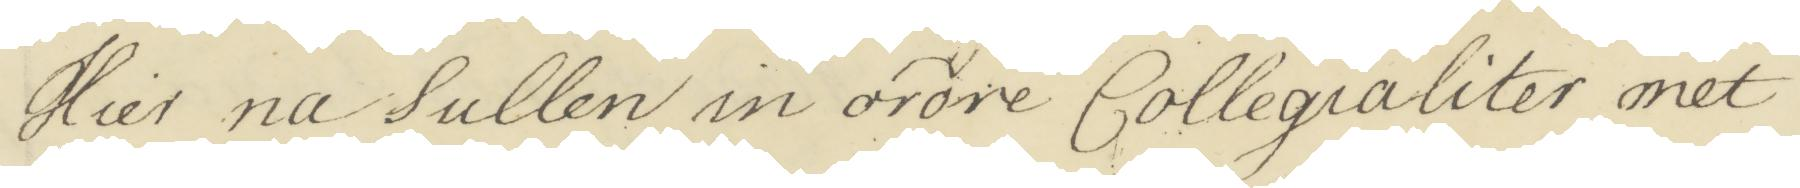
Hier na sullen in ordre collegialiter met
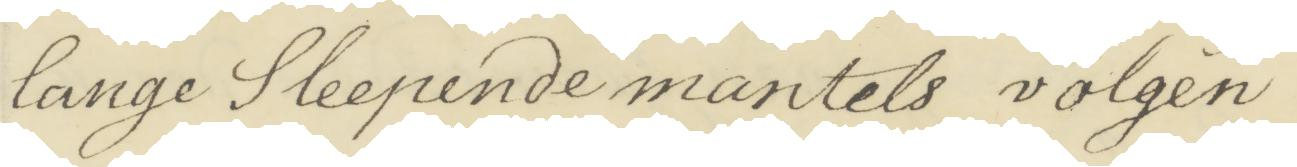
lange sleepende mantels volgen
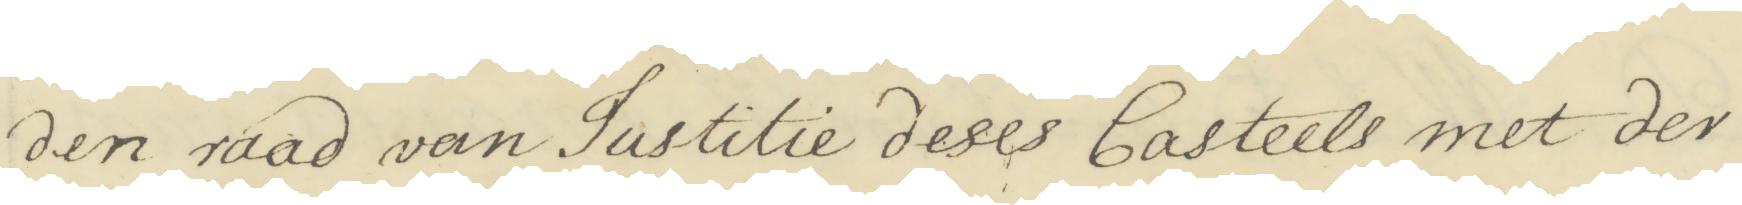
den raad van Iustitie deses Casteels met der
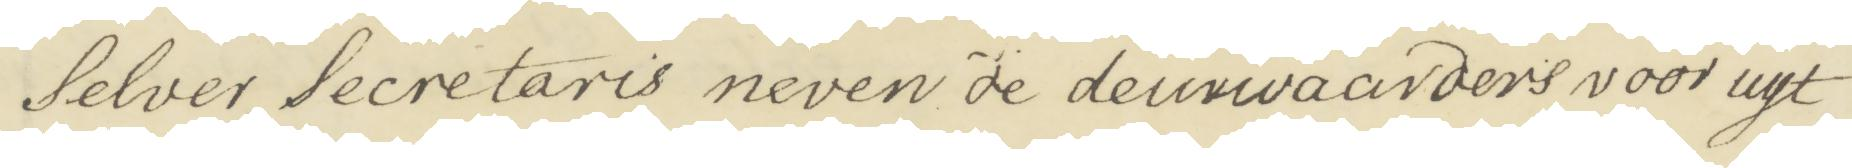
selver Secretaris neven de deurwaarders voor uyt
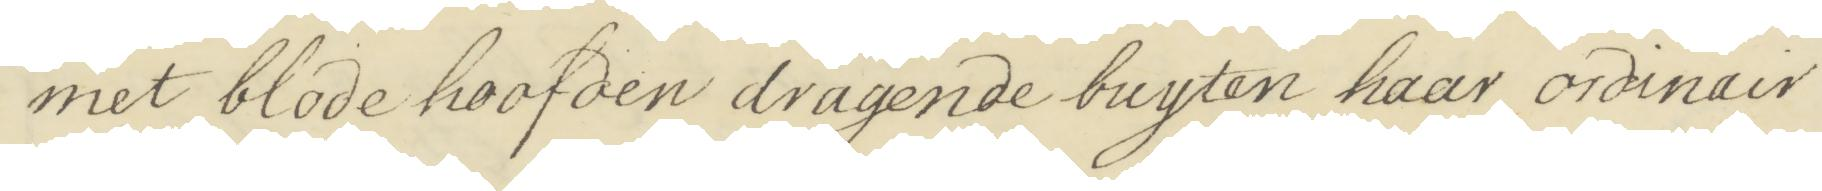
met blode hoofden dragende buyten haar ordinair
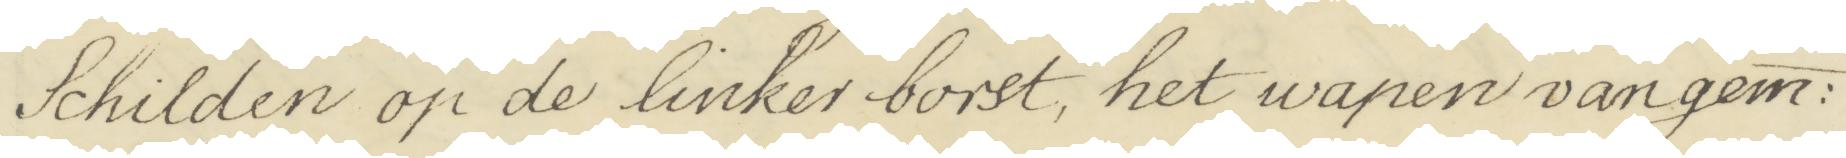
schilden op de linker borst, het wapen van gem:
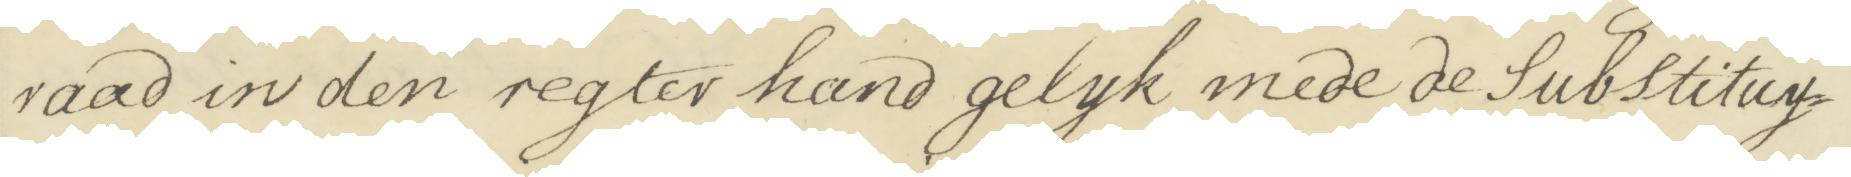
raad in den regter hand gelyk mede de substituy=
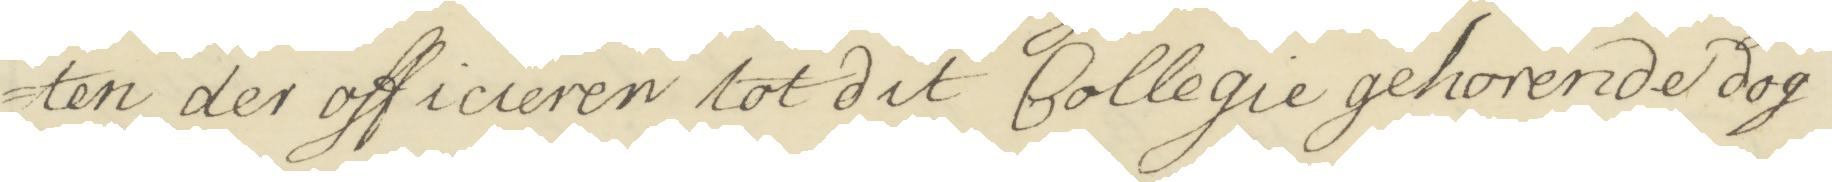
=ten der officieren tot dit Collegie gehorende dog
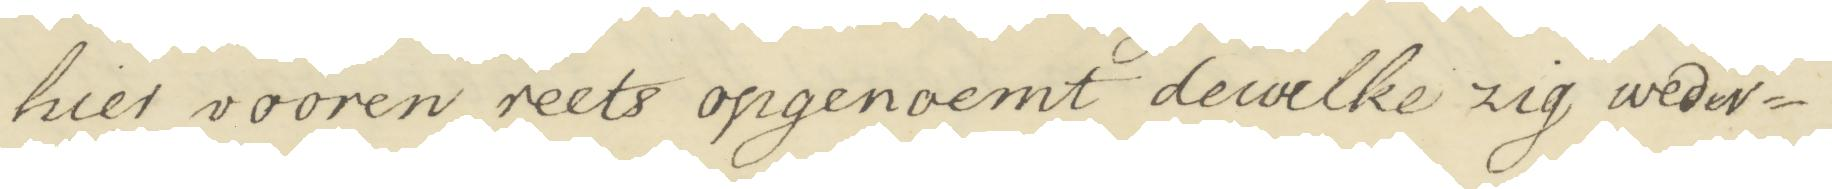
hier vooren reets opgenoemt dewelke zig weder=
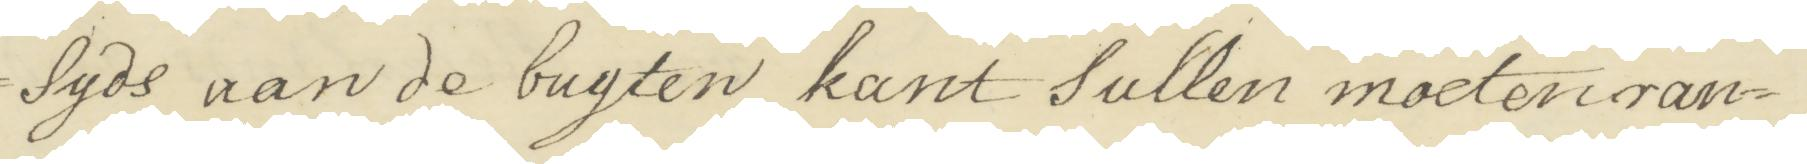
syds aan de buyten kant sullen moeten ran=
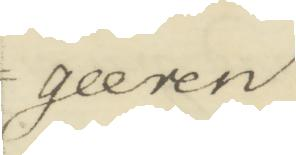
=geeren
